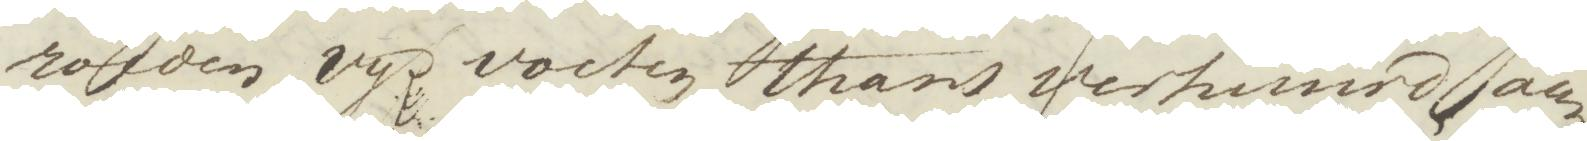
roeden vyf voeten thans verhuurd aan
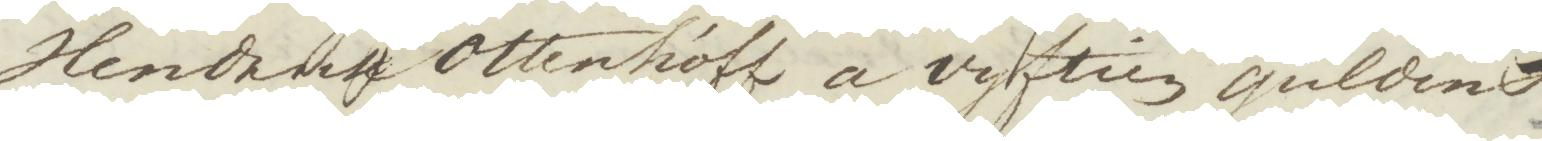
Hendrik Ottenhoff a vyftien guldens
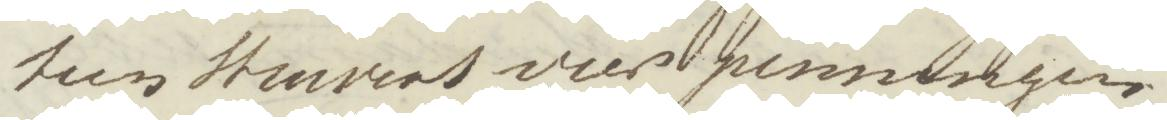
tien stuivers vier penningen
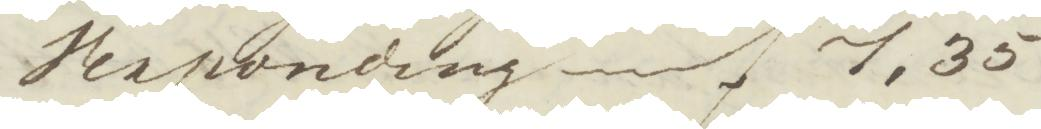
Verponding ƒ 7,35
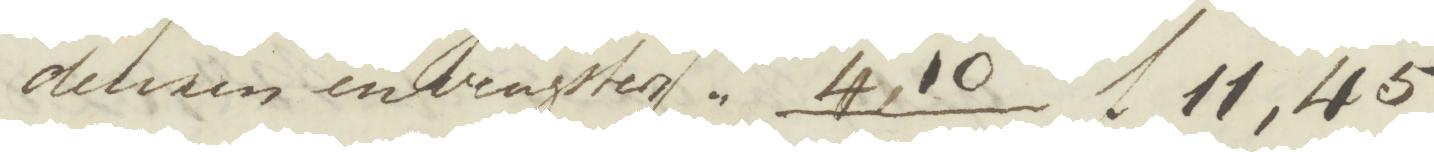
deuren en vengsters „ 4,10 ƒ 11. 45
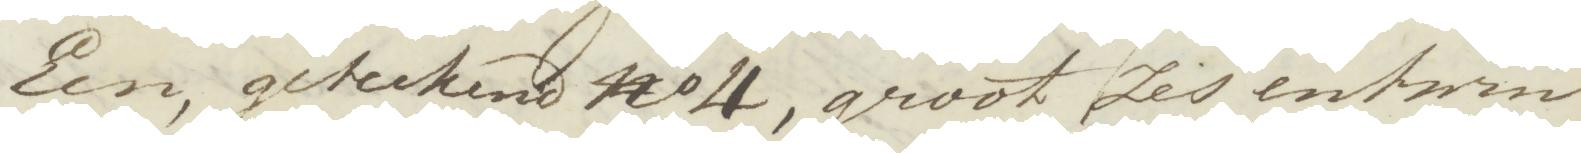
Een, geteekend N=o 4, groot zes entwin
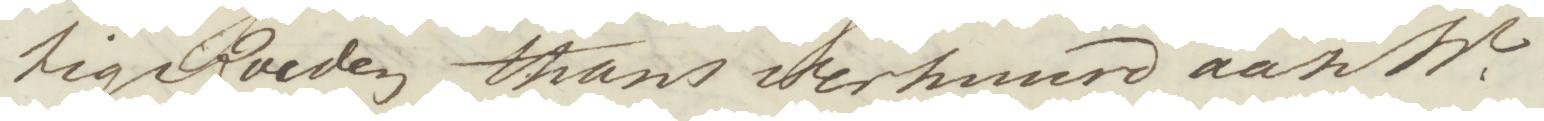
tig Roeden, thans verhuurd aan W.
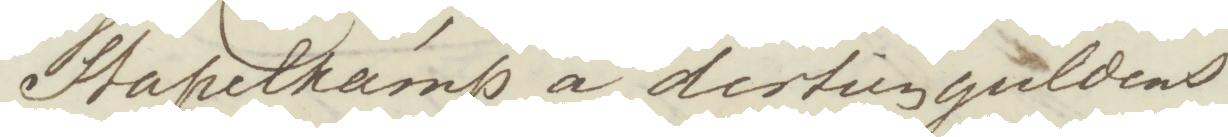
Stapelkamp a dertien guldens
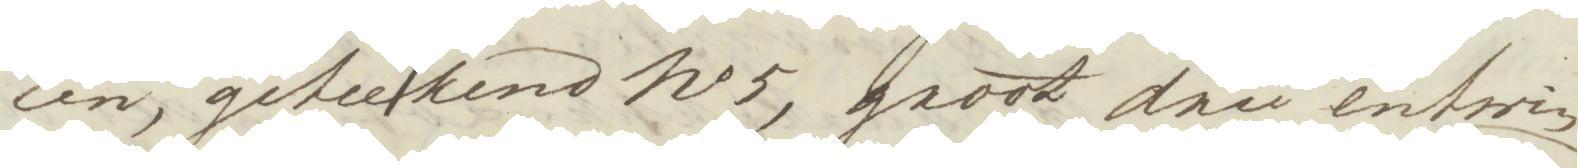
Een, geteekend No 5, groot drie entwin
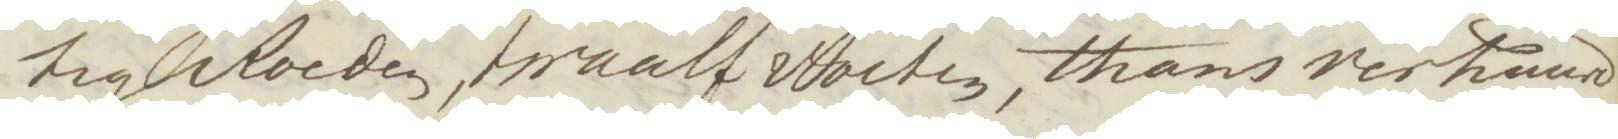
tig Roeden, twaalf voeten, thans verhuurd
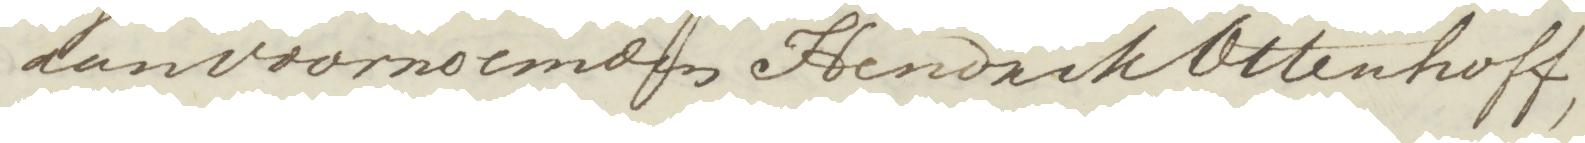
aan voornoemden Hendrik Ottenhoff,
